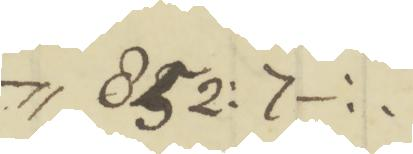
„ 852:7—:.
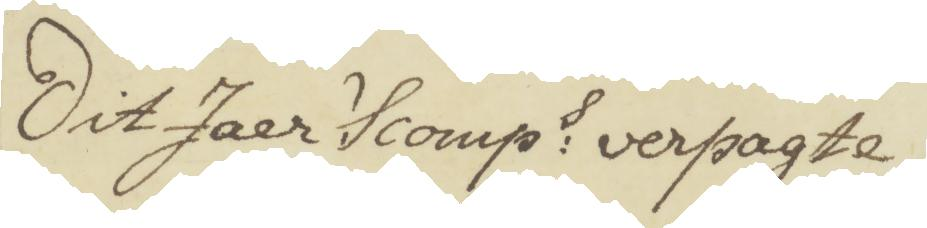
dit Jaer 's comp:s verpagte
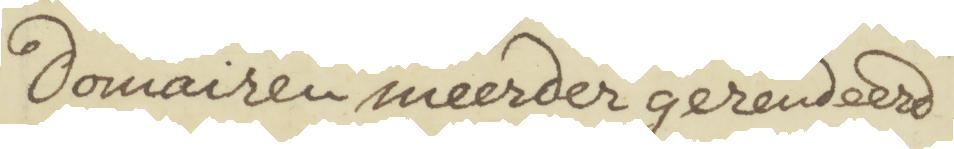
domairen meerder gerendeerd
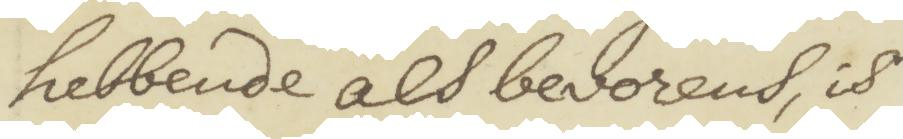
hebbende als bevorens, is
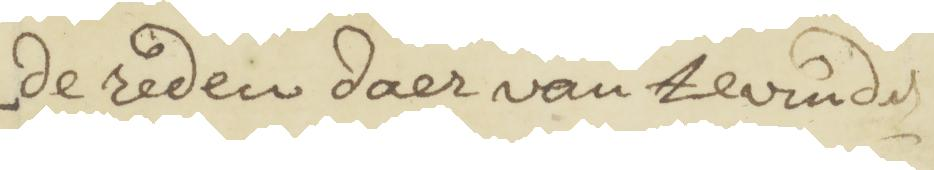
de reden daer van tevinden
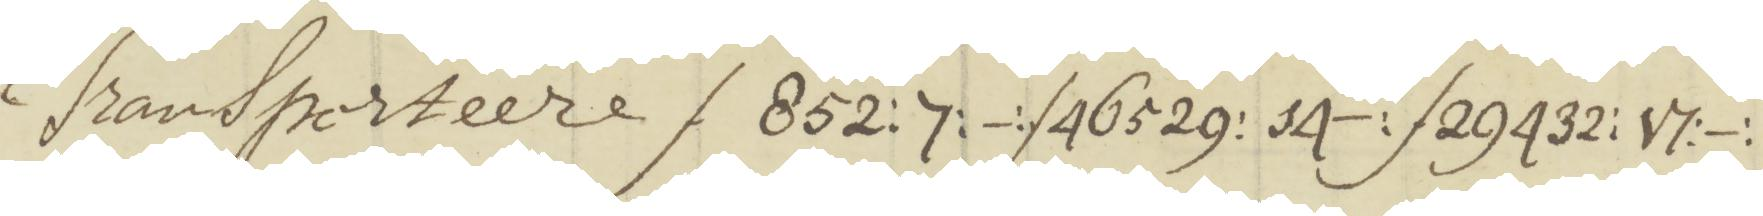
Transporteere ƒ 852: 7:—:ƒ46529:14—:ƒ29432:17:—:
